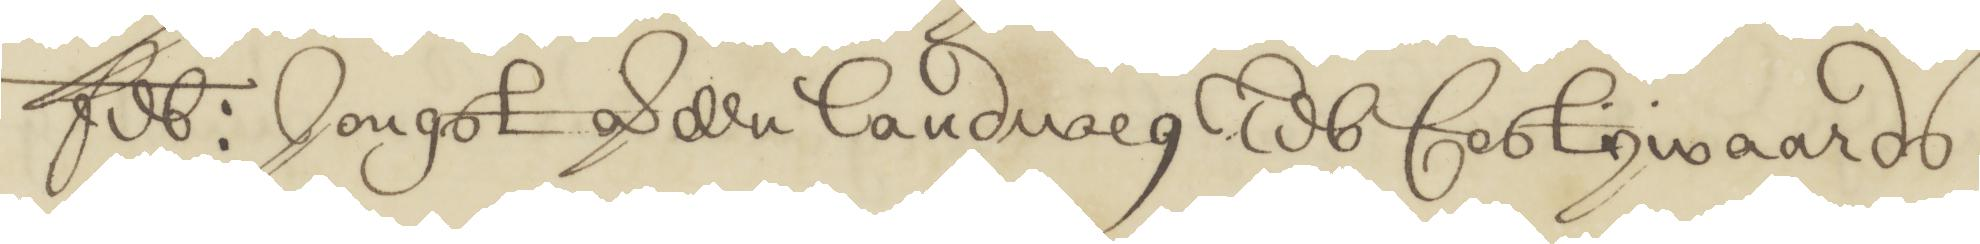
feb: Jongst over den landweg heb Costijwaards
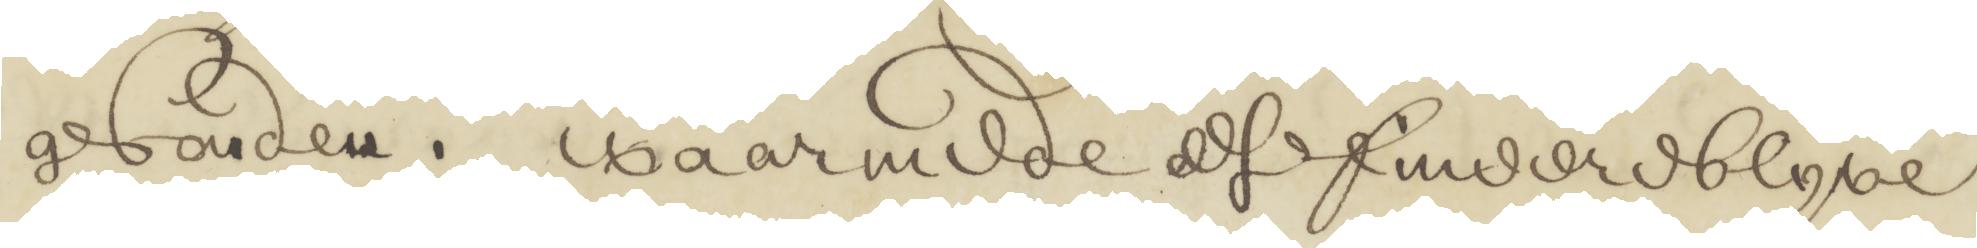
gesonden. waarmede dese fineere blijve
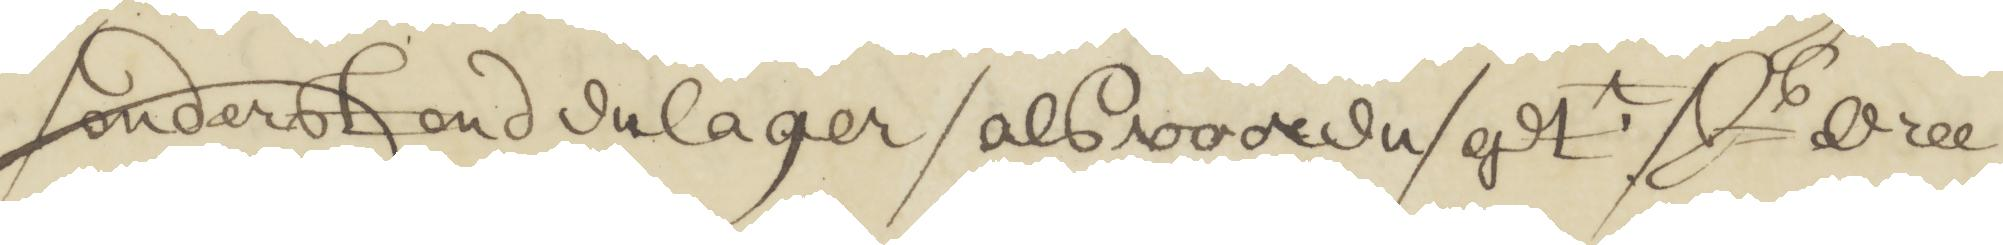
/onderstond en lager / als vooren/ get:t /J=s de ree
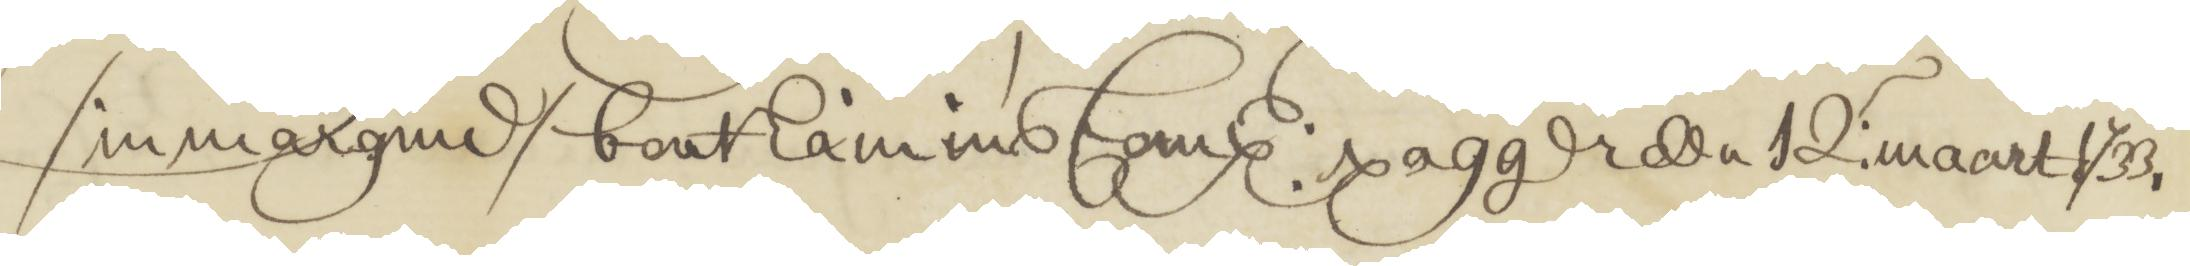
/in margine/ borthain in's Comp:s pagger den 12:' maart 1733.
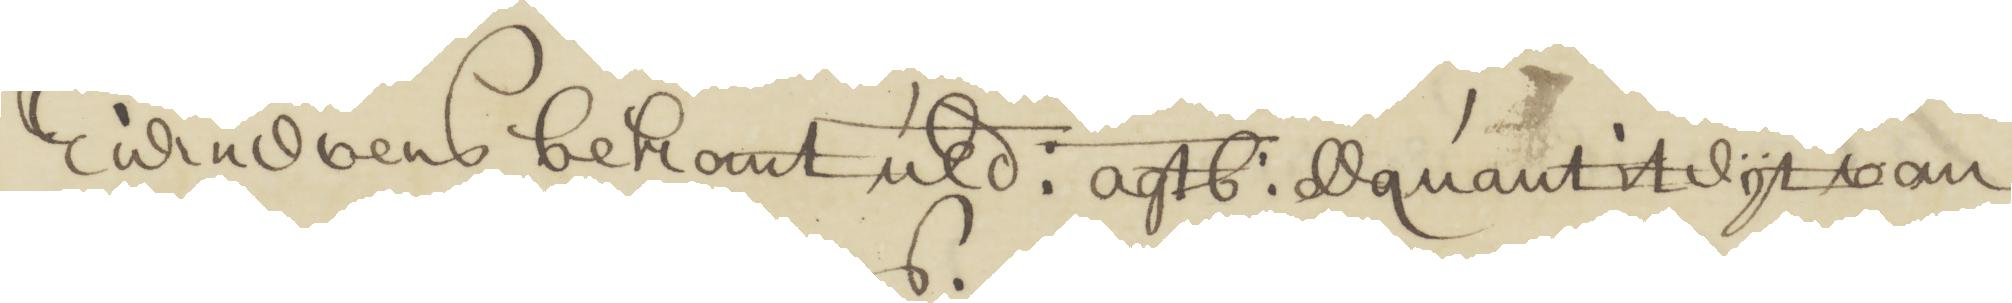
hiernevens bekomt uEd: agtb: de quantiteijt van
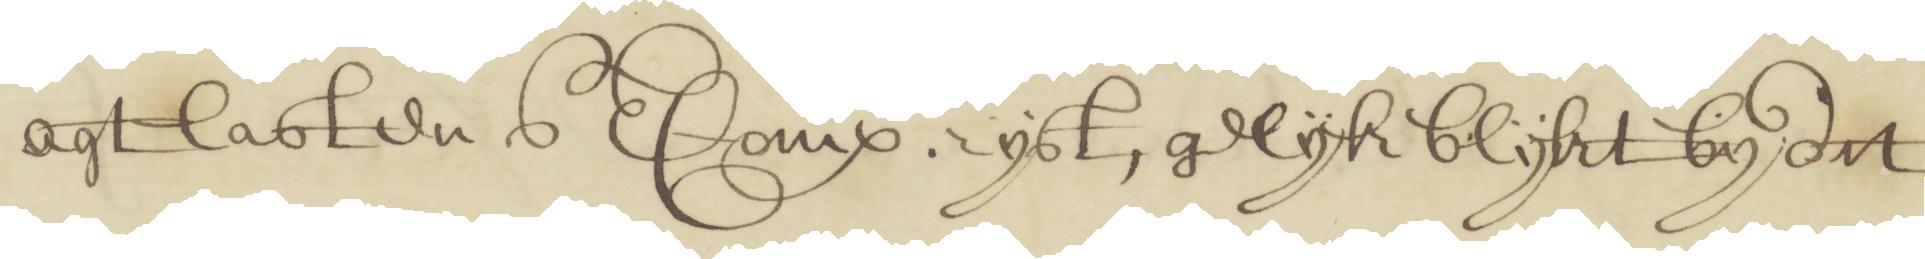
agt lasten 'sEComp:s rijst, gelijk blijkt bij dit
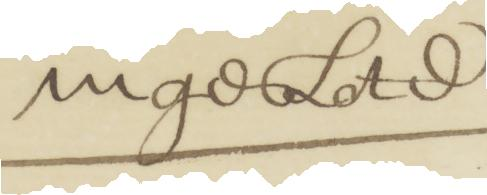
ingeslote
